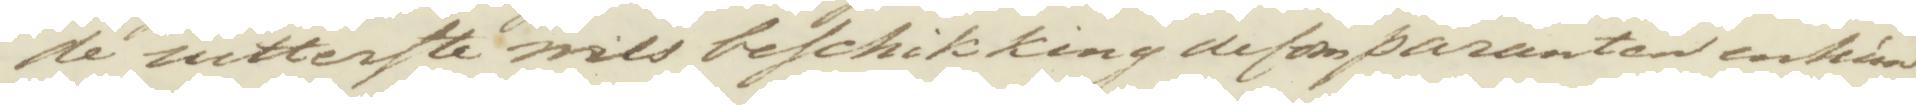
de uitterste wilsbeschikking de Comparanten en hun
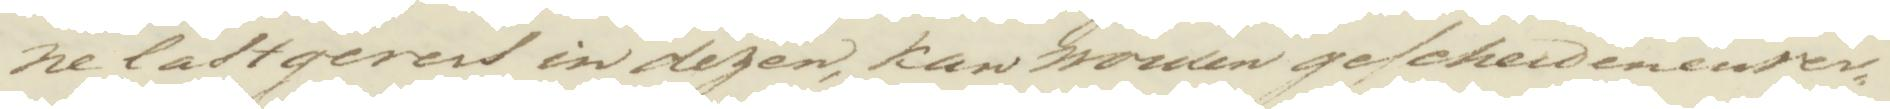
ne lastgevers in dezen, kan worden gescheiden en ver„
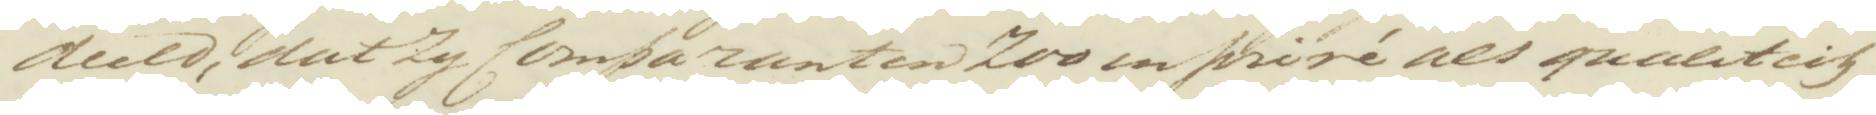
deeld, dat Zy Comparanten Zoo in privé als qualiteit
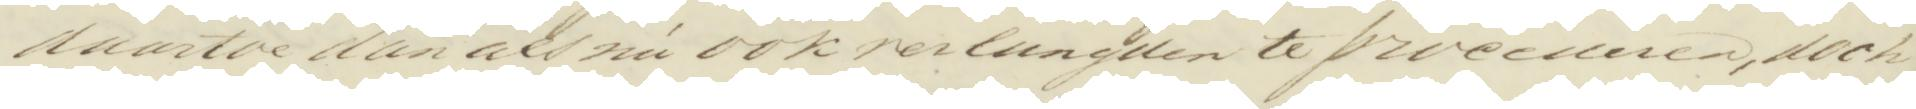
daartoe dan als nu ook verlangden te procederen, doch
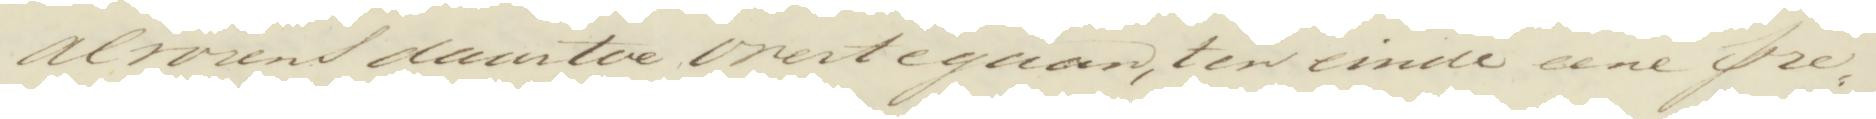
alvorens daartoe overtegaan, ten einde eene pre„
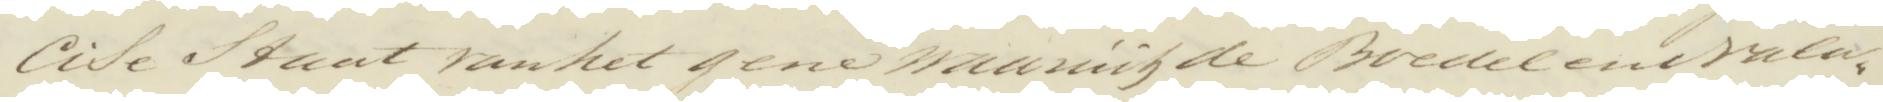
cise Staat van het gene waaruit de Boedel en Nala„
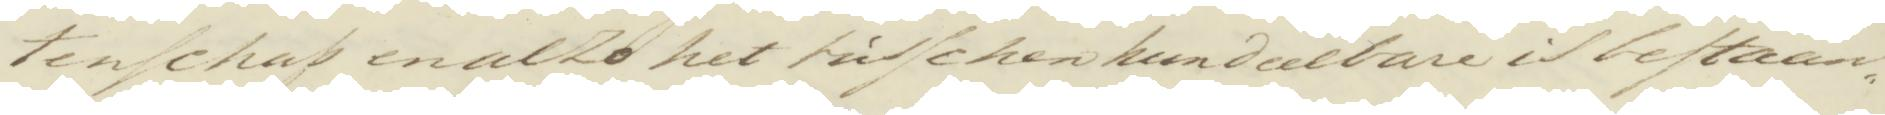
tenschap en alzo het tusschen hun deelbare is bestaan„
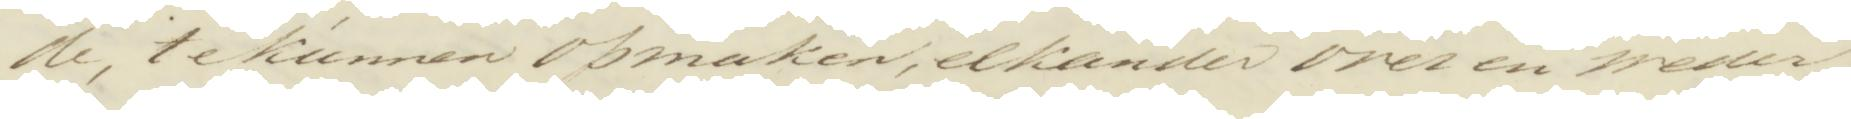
de, te kunnen opmaken, elkander over en weder
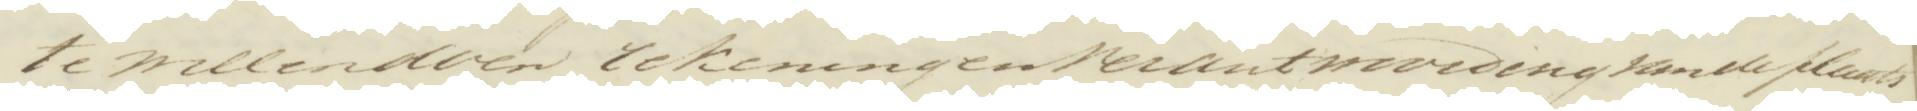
te willen doen rekening en verantwoording van de plaats
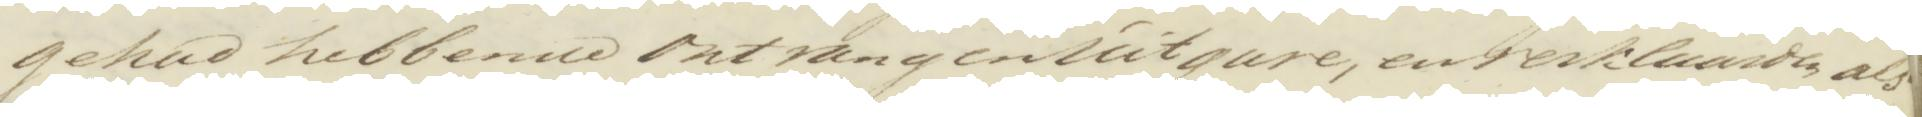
gehad hebbene ontvang en uitgave, en verklaarden als
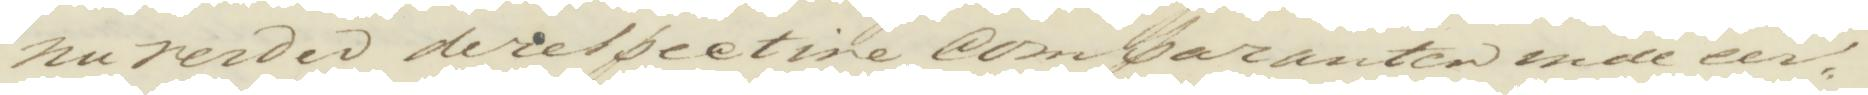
nu verder de respective comparanten in de eer„
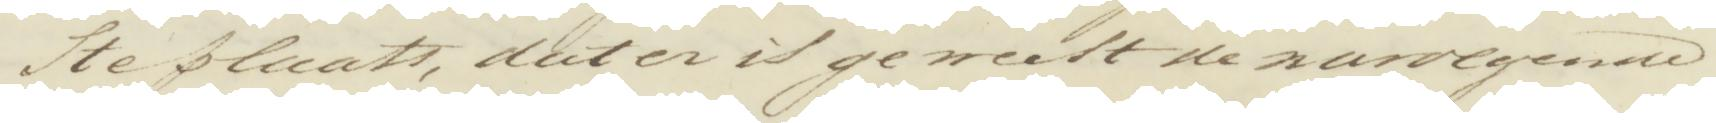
ste plaats, dat er is geweest de navolgende
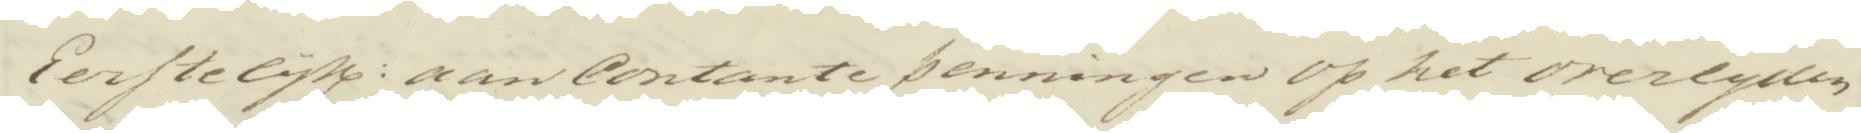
Eerstelijk aan contante penningen op het overlyden
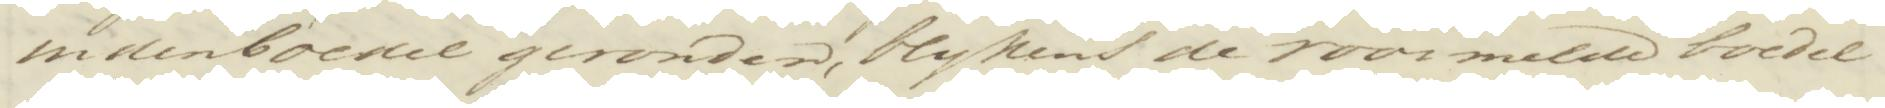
in den boedel gevonden, blykens de voormelde boedel
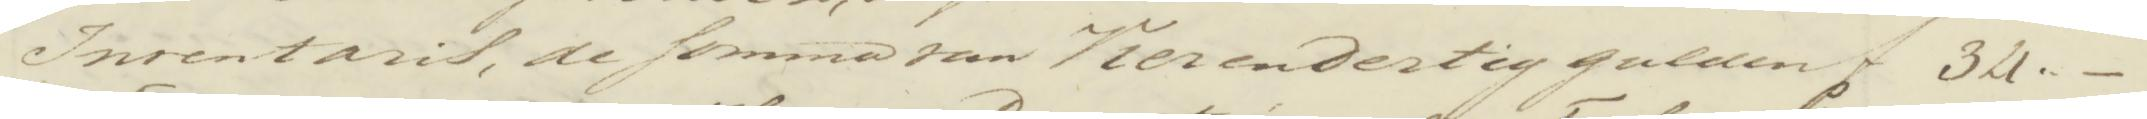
Inventaris, de somma van Vier en dertig gulden ƒ 34. -
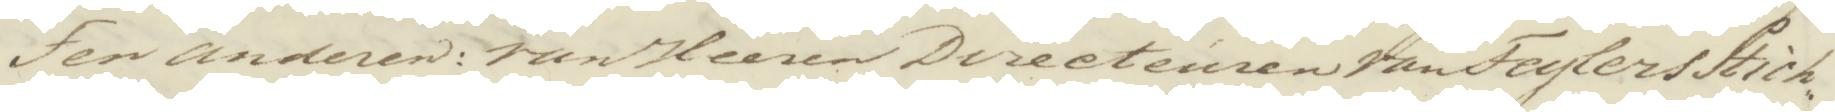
Ten anderen: van Heeren Directeuren van Teylers Stich„
